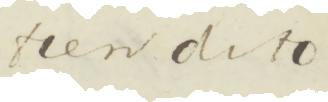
tien dito
